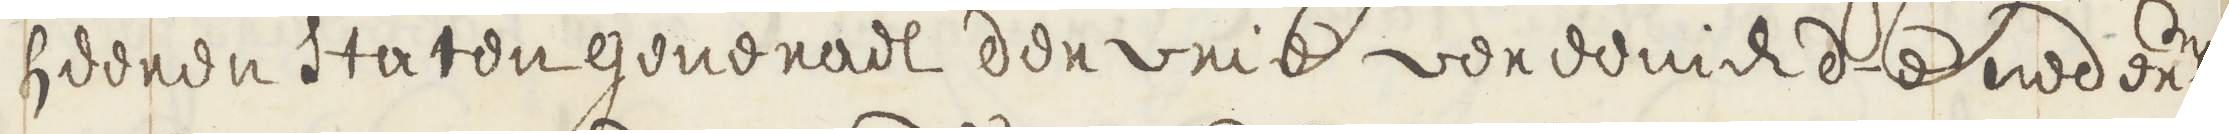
heeren staten generael der vrie vereenichd-e nederln
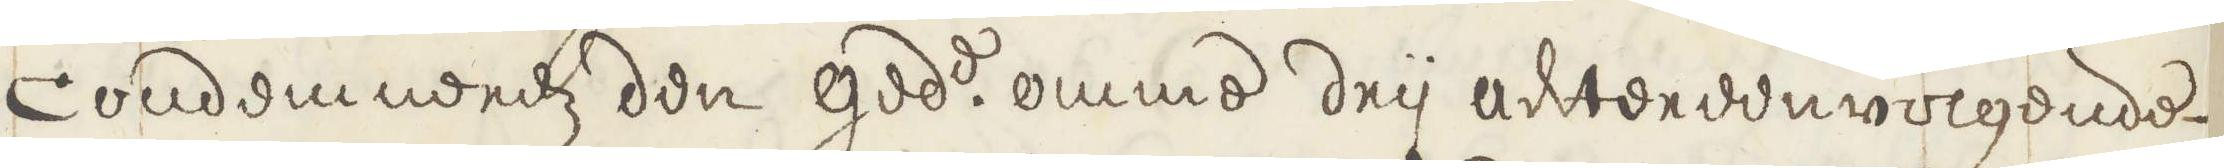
condemneren den ged:e omme drij achtereenvolgende-
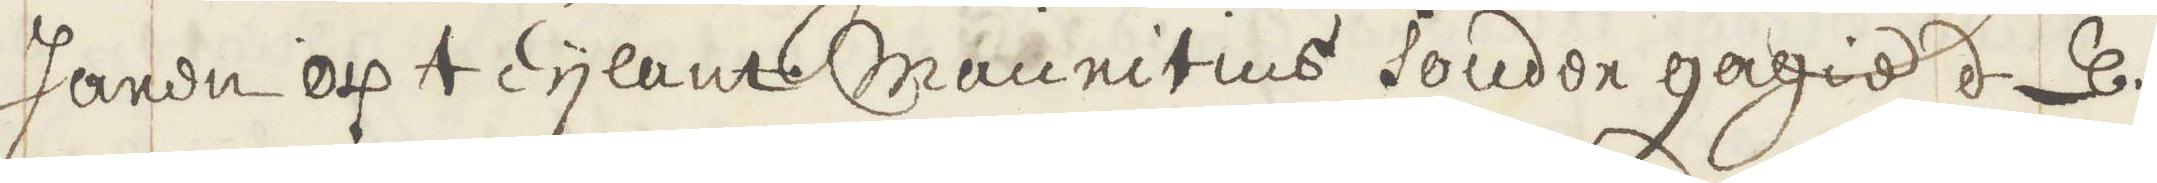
Jaren op ’t eijlante mauritius sonder gagie d E.
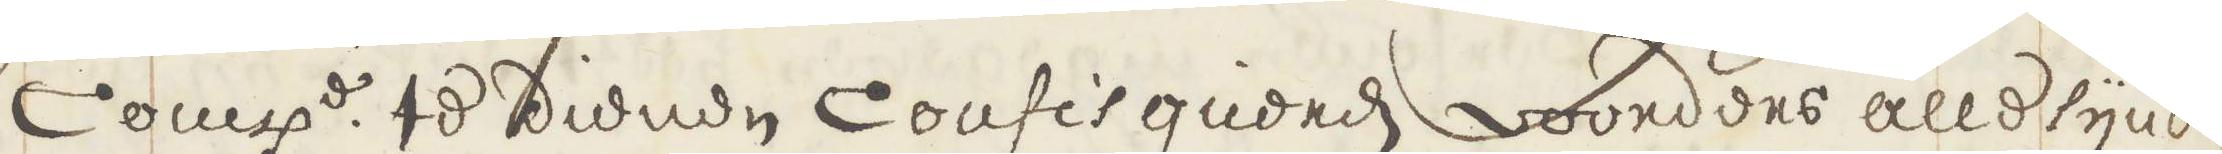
Comp.s te dienen confisqueren voorders alle sijne
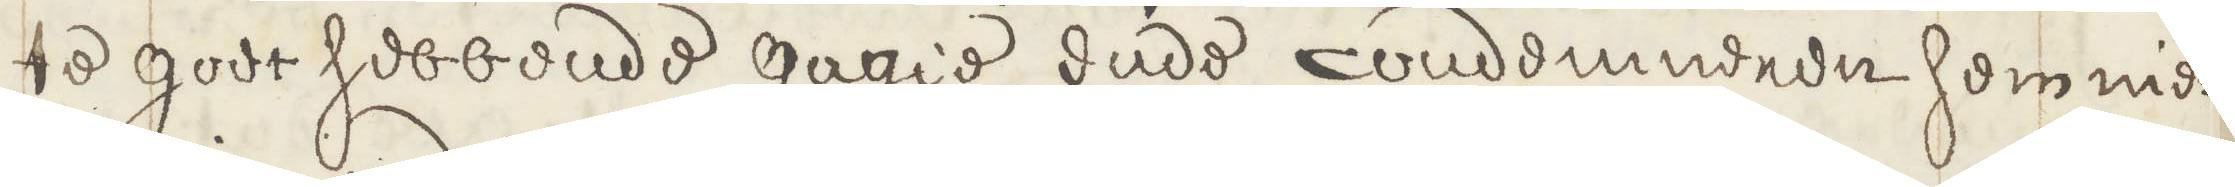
te goet hebbende gagie ende condemneren hem niet
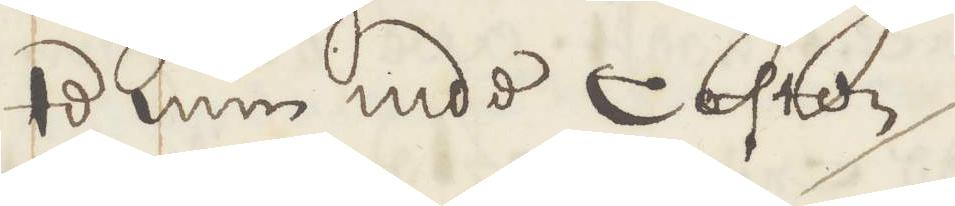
te min inde Costen
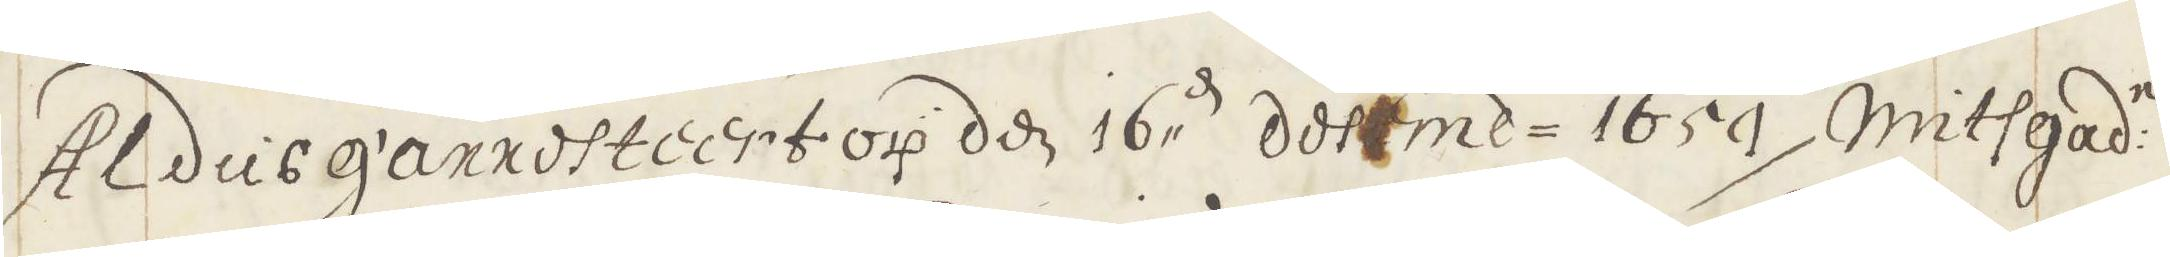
Aldus g’arresteert op den 16„e desemb= 1659, mitsgad:rs
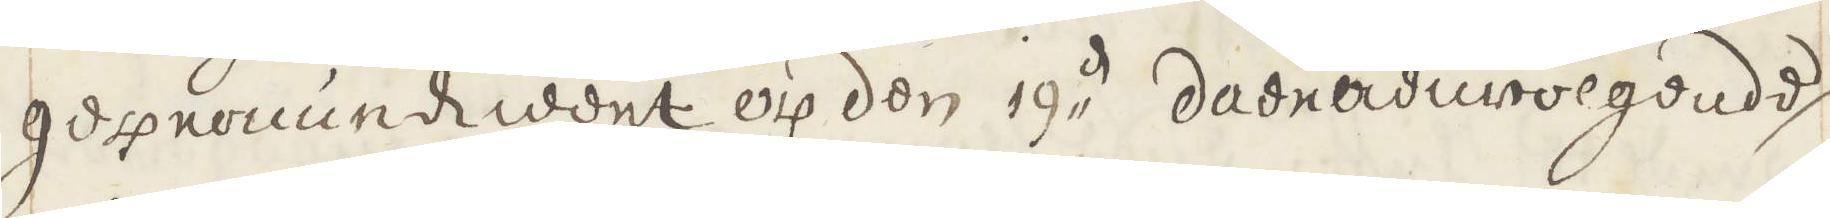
gepronunchieert op den 19„e daeraenvolgende
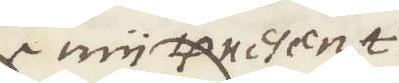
^ mij present
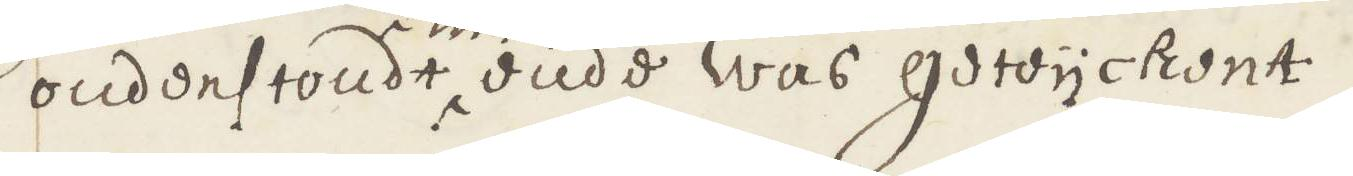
onderstondt ^ ende was geteijckent
